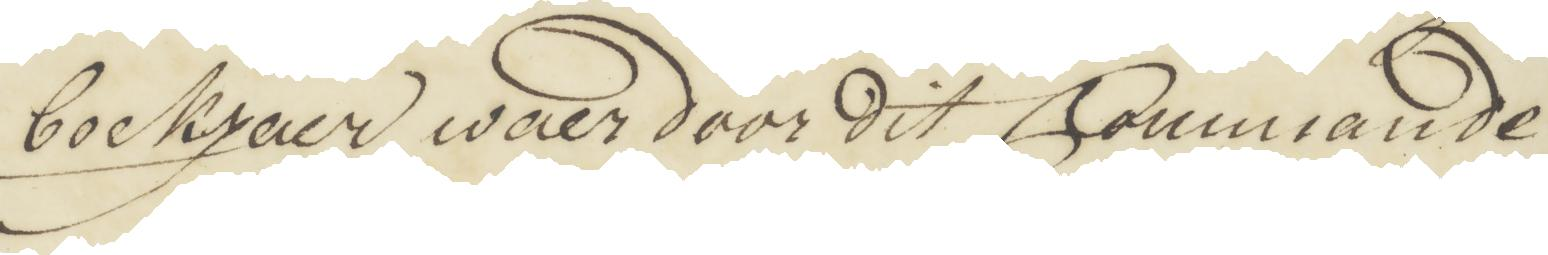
boekjaer, waer door dit Commande
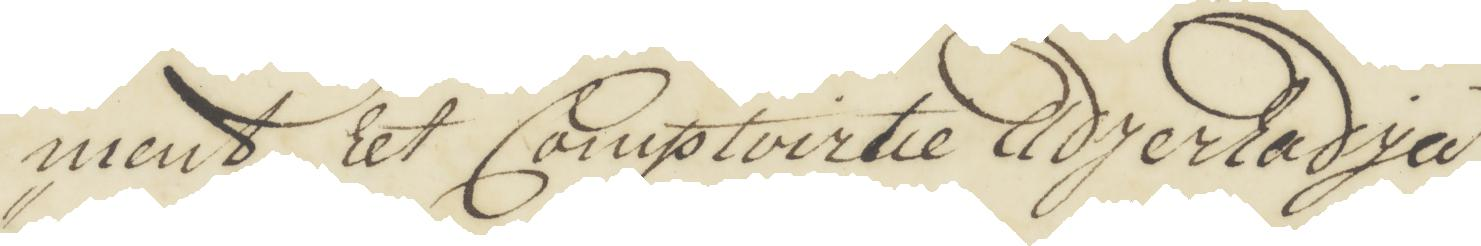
„ment, het Comptoirtie Adjerhadja,
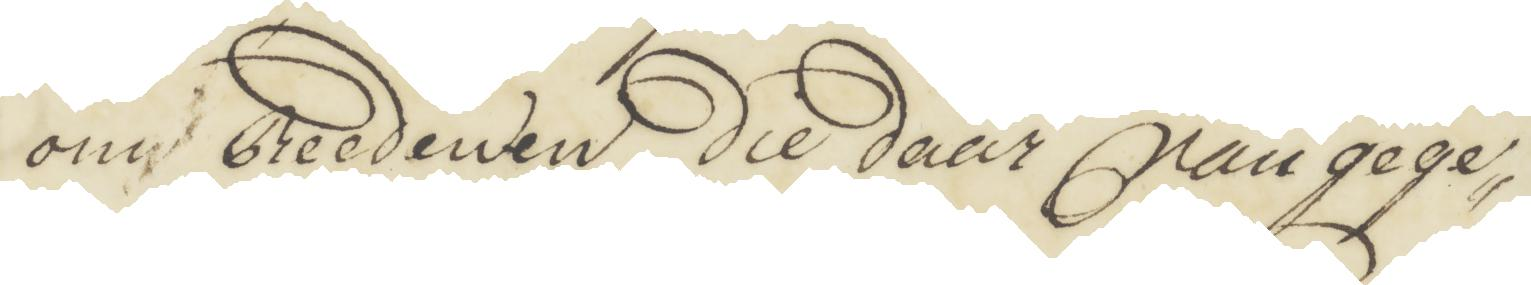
om Reedenen die daar van gege„
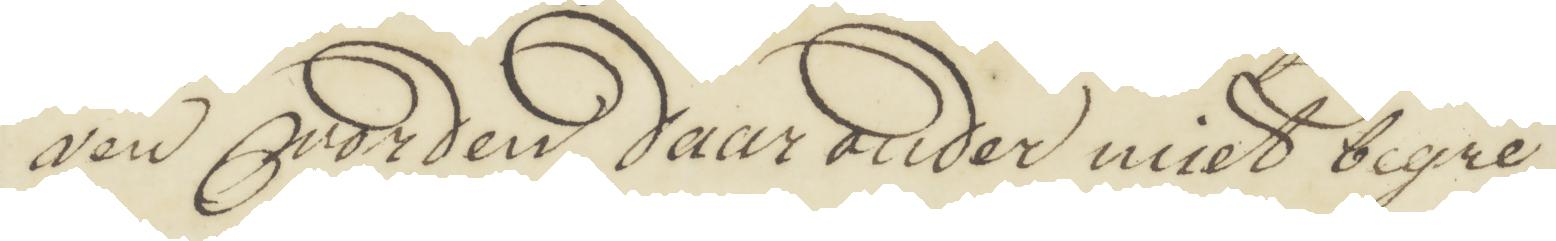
ven worden, daar onder niet begre
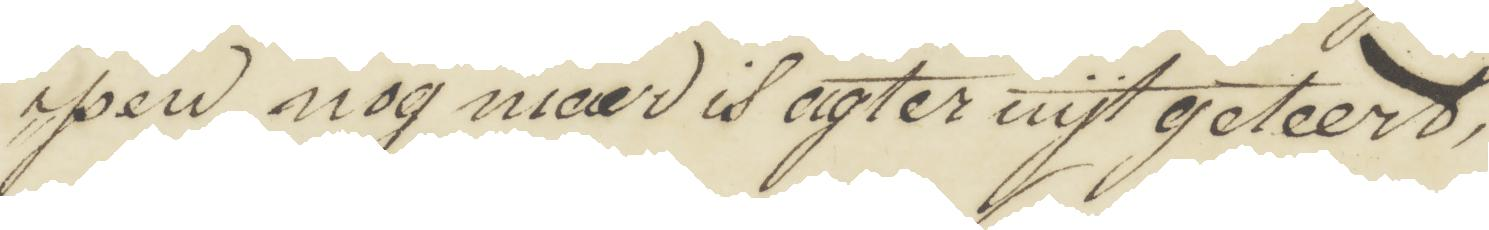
„pen, nog maer is agter uijt geteert,
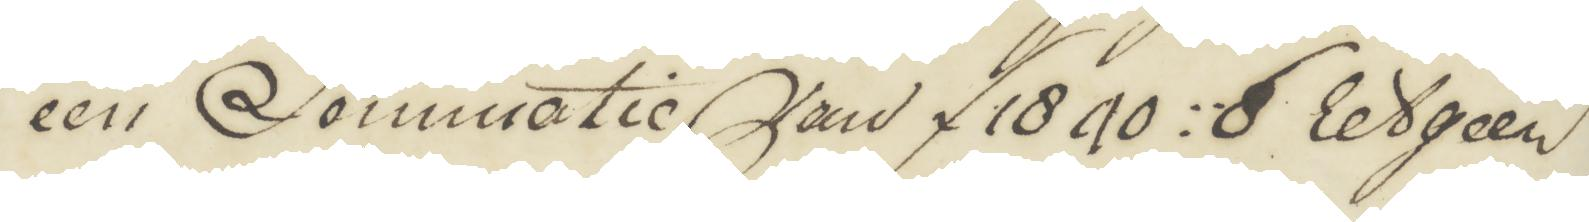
een Sommatie van ƒ1840: 6 hetgeen
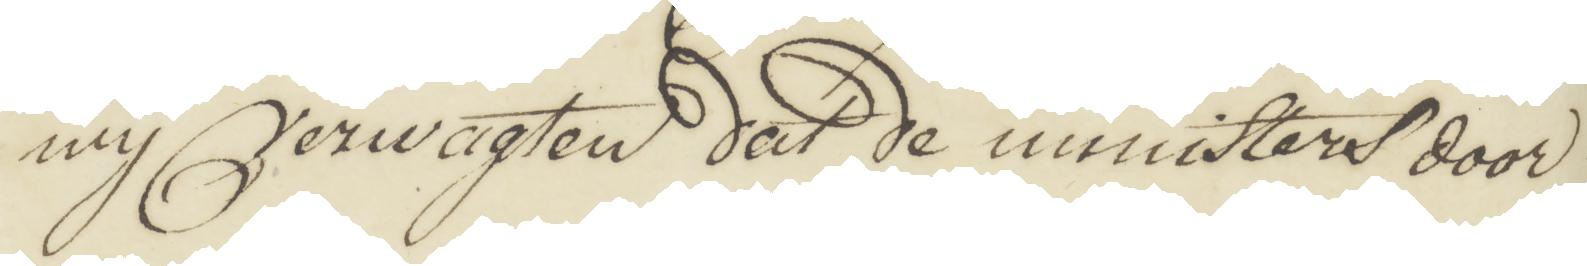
wij verwagten dat de ministers door
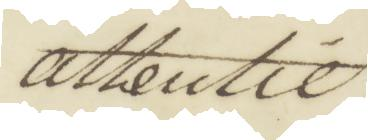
attentie
